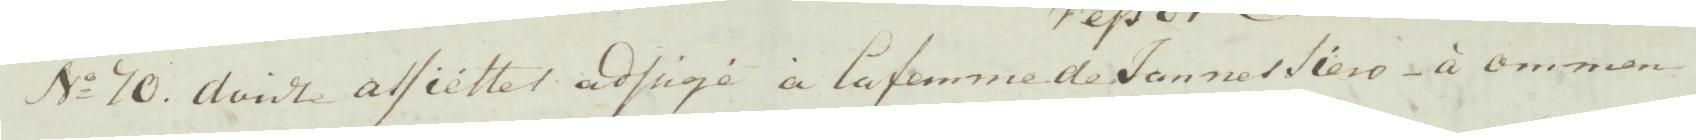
N=o 70. douze assièttes adjugé à la femme de Iannes Siero - à Ommen
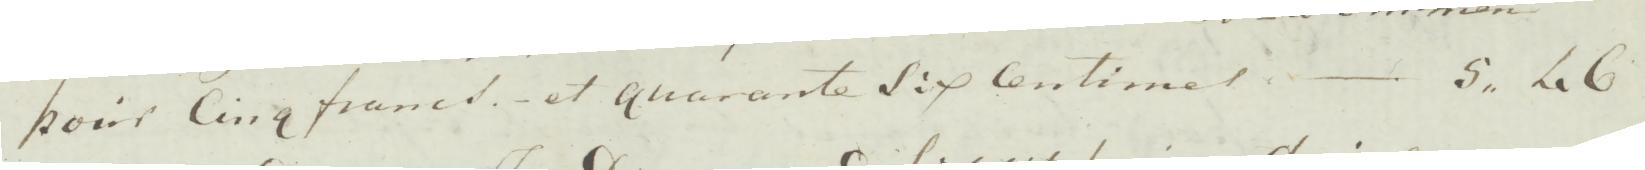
pour Cinq francs. - et quarante Six Centimes — 5„46
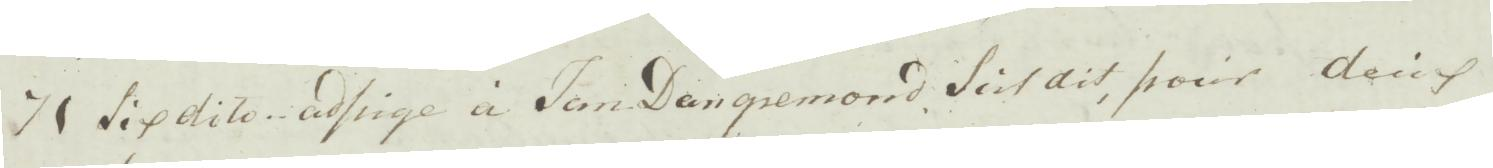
71 six dito - adjuge à Ian Dangremond Sus dit, pour deux
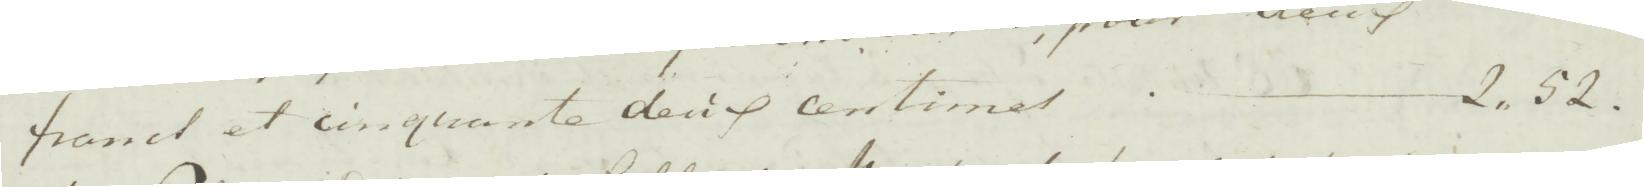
francs et cinquante deux centimes — 2„52.
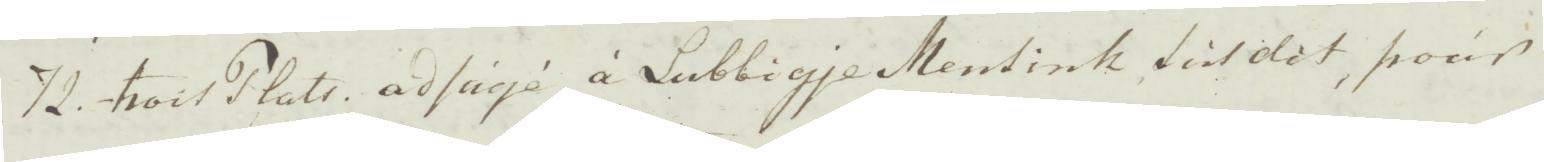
72. trois Plats, adjugé à Lubbigje Mensink, Sus dit, pour
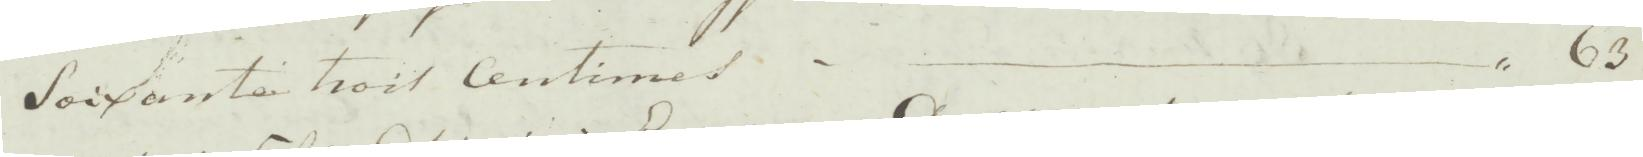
Soixante trois Centimes - — „ 63
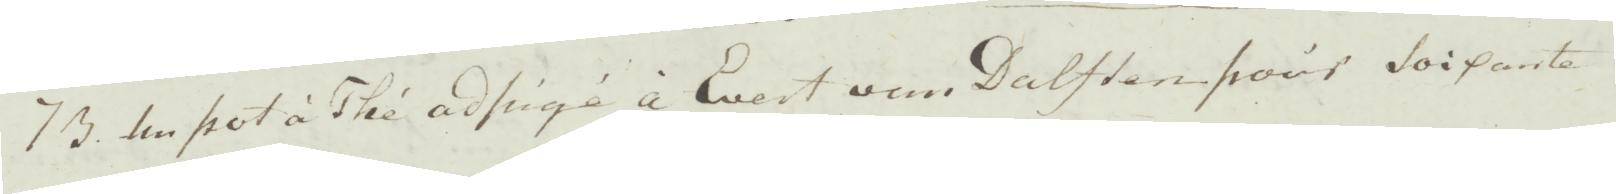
73. Un pot à Thé adjugé à Evert van Dalfsen pour soixante
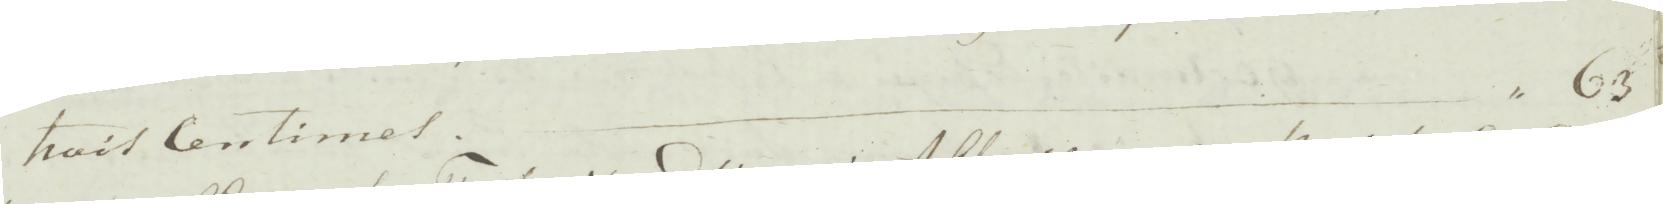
trois Centimes. — „ 63
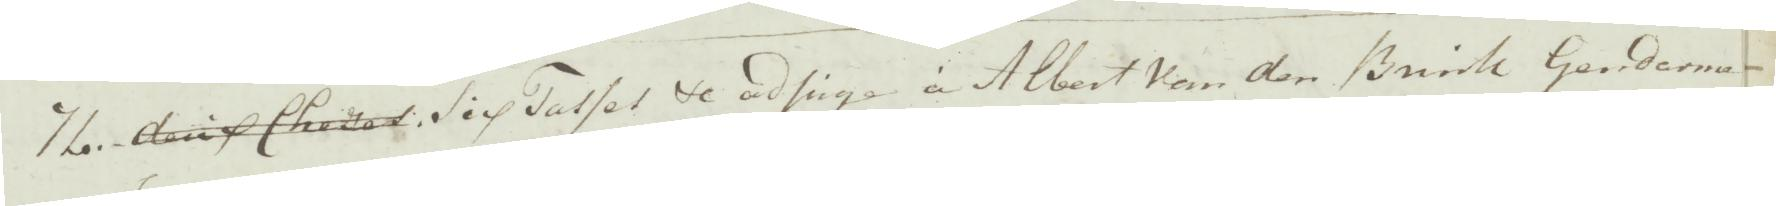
74.- deux Chezas, Six Tasses se adjugé à Albert van den Brink Gendarme¬
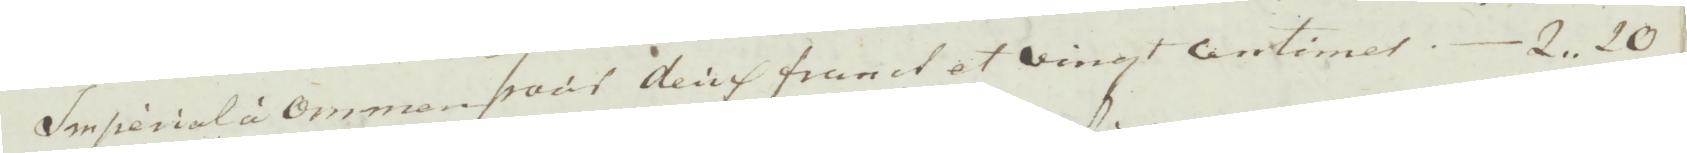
Impérial à Ommen pour deux francs et vingt Centimes. — 2„20
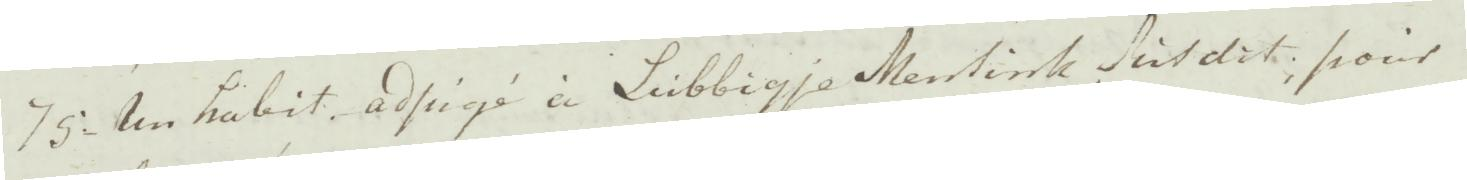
75. Un habit adjugé à in Lubbigje Mensink Sus dit, pour
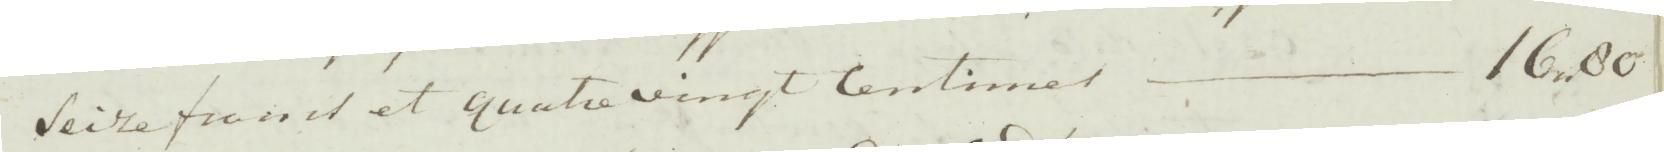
seize francs et quatre vingt Centimes — 16„80
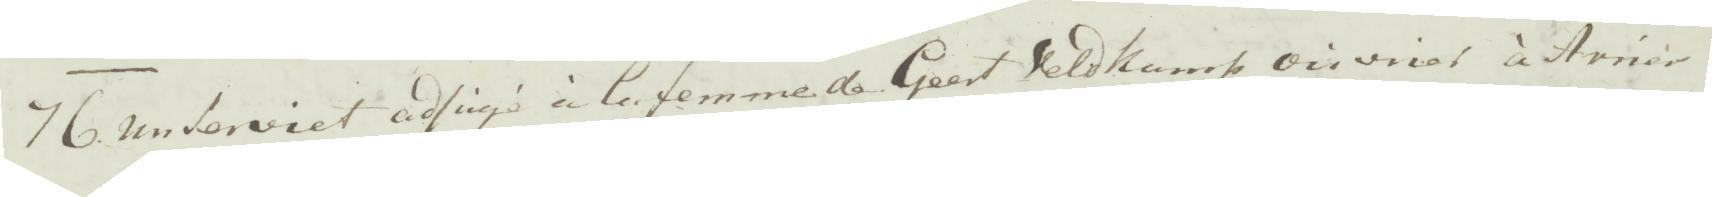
76. un Serviet adjugé à la femme de Geert Veldkamp ouvier à Arrien
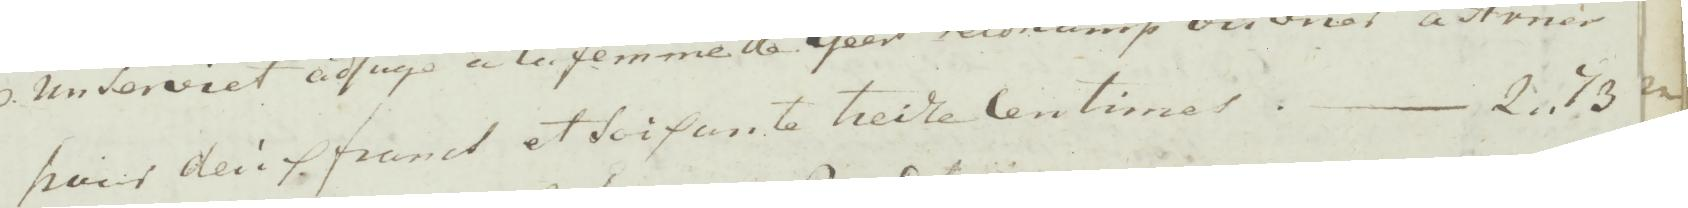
pour deux francs et soixante treize Centimes — 2„73
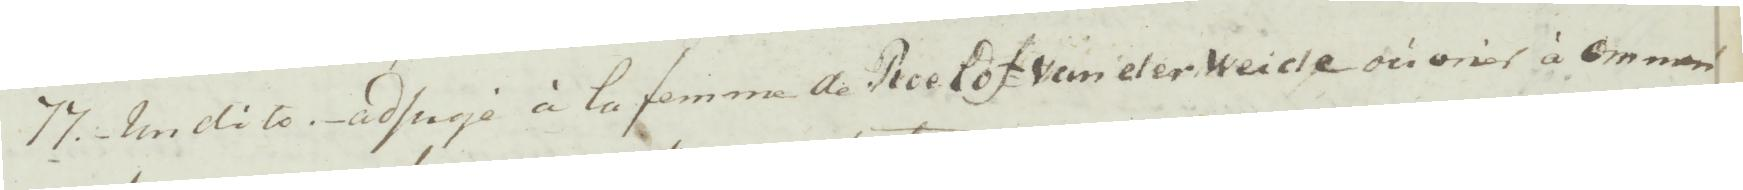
77.- Un dito. -adjugé à la femme de Roelof van der Weide ouvrier à Ommen
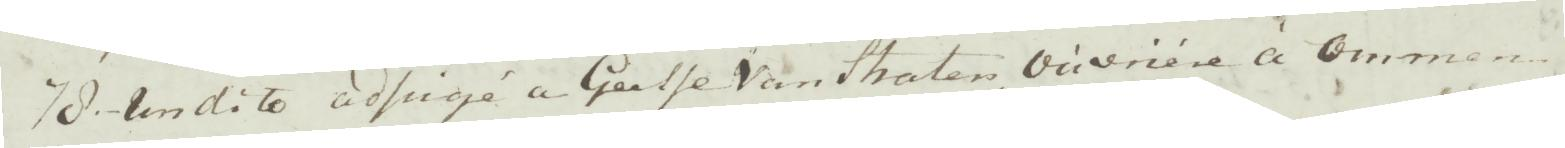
78.- Un dito adjugé à Geesje van Straten, Ouvrière à Ommen
